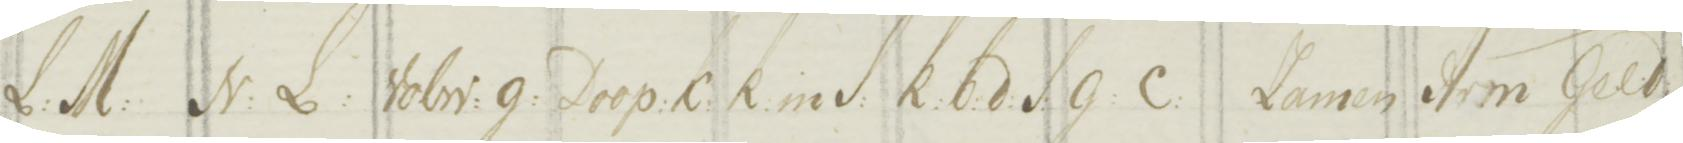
L: M: N: L: Volw: g: Doop: k: k: in S: k: b: d: S: g: c: Zamen Arm Geld
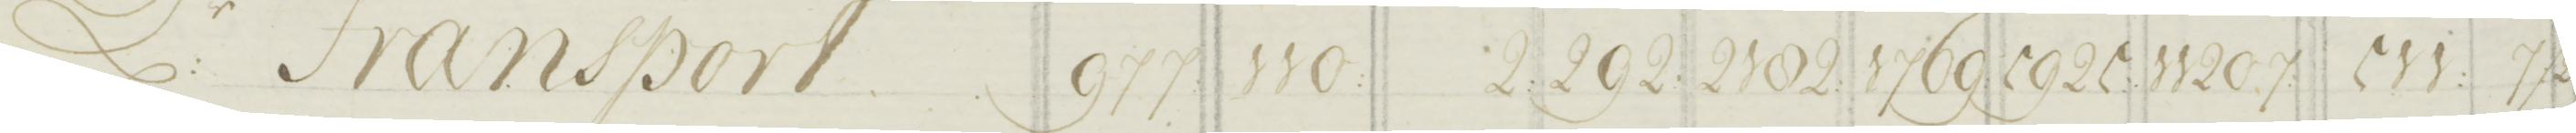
P:r Transport 977: 110: 2: 292: 2182: 1769: 5925: 1120: 7: 511: 7½
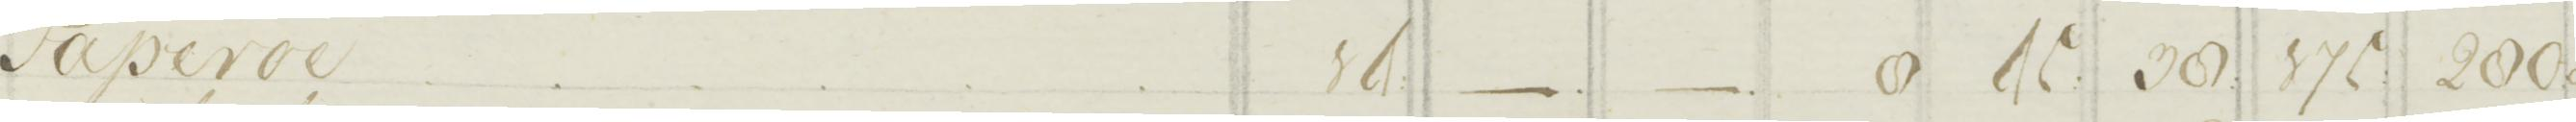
Paperoe - - - - - - 14: —. —. 8 45: 38: 175: 280
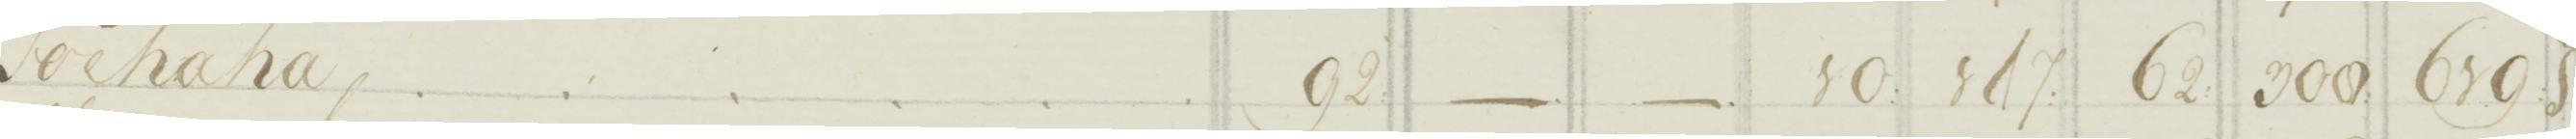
Toehaha - - - - - - 92: —. —. 10: 147: 62: 308: 610:)
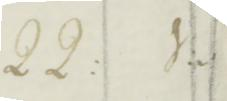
22: 1:.
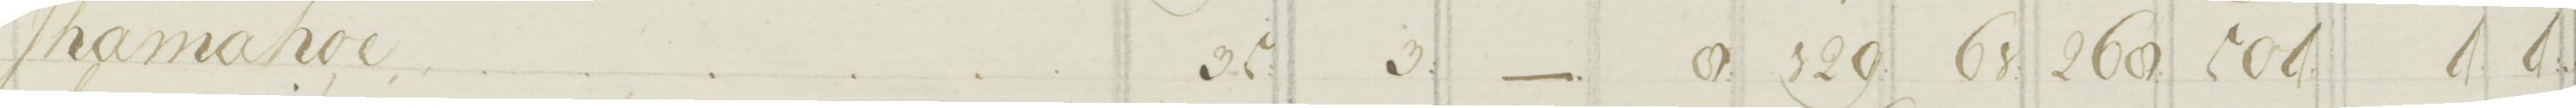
Jhamahoe - - - - - 35: 3: —. 8: 129: 61: 268: 504: 4: 4:.
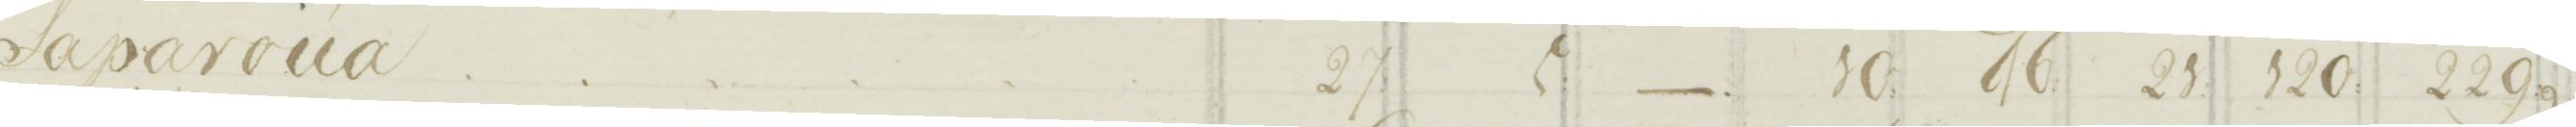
Saparoua - - - - - - 27: 5: —. 10: 46: 21: 120: 229:
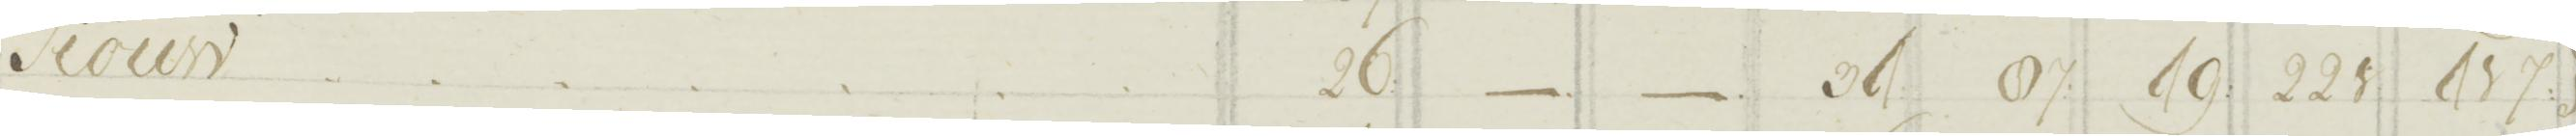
Tiouw - - - - - - - 26: —. —. 34: 87: 49: 221: 417:
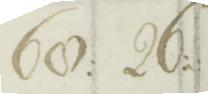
68: 26:.
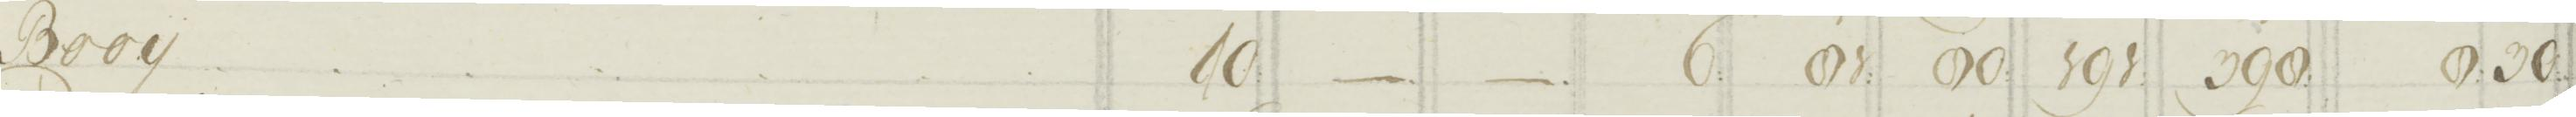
Booij - - - - - - - 40: —. —. 6: 81: 80: 191: 398: 8: 30:.
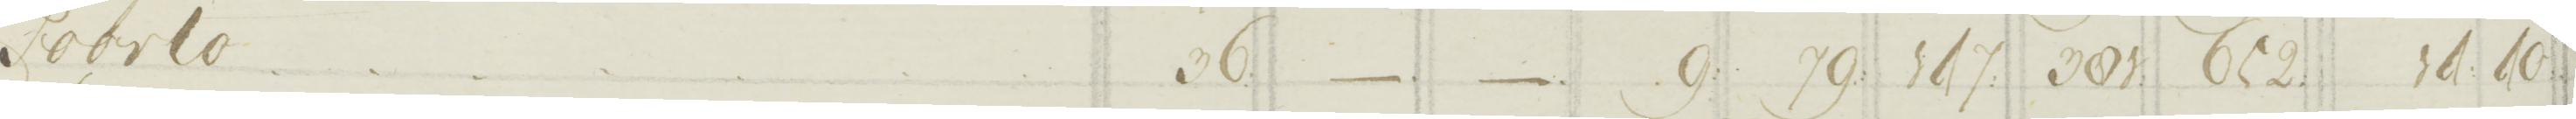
Poorto - - - - - - - 36: —. —. 9: 79: 147: 381: 652: 14: 40:.
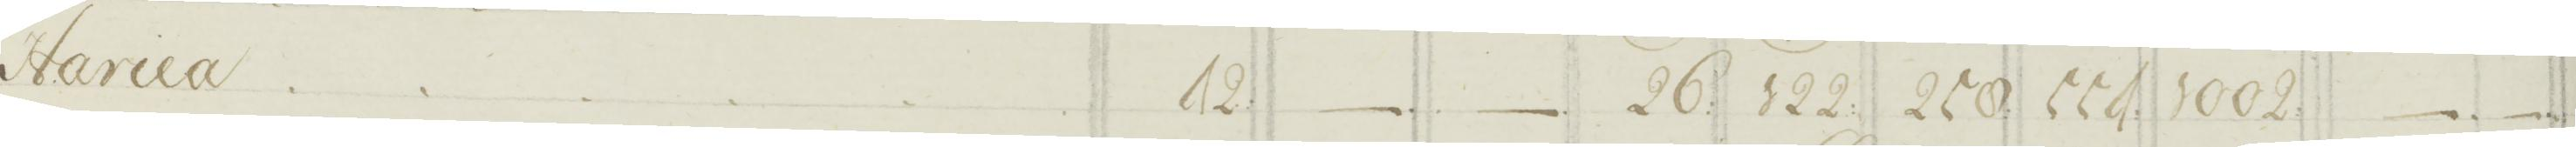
Hariea - - - - - - 42: —. —. 26: 122: 258: 554: 1002: —. —..
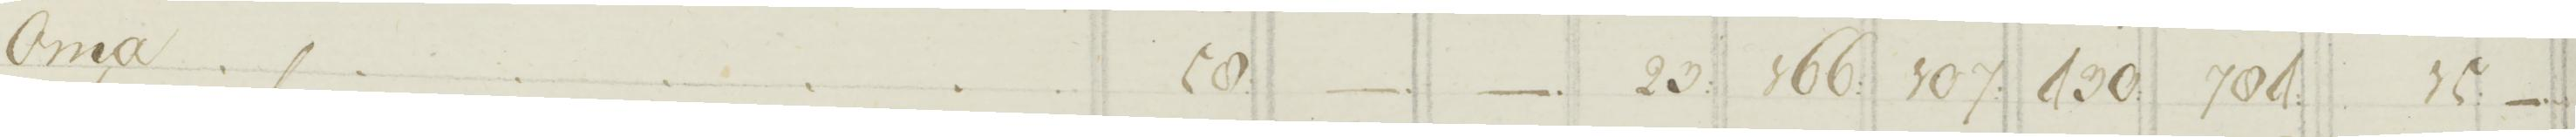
Oma - - - - - - - 58: —. —. 23: 166: 107: 430: 784: 15
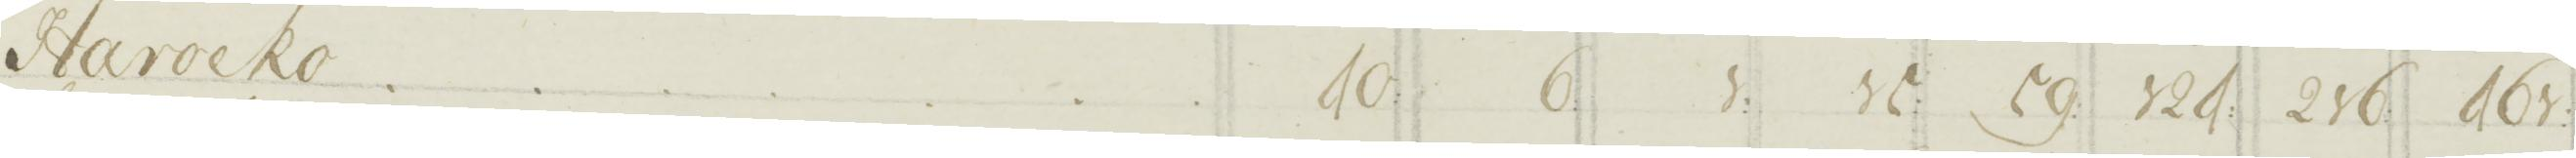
Haroeko - - - - - - 40: 6: 1: 15: 59: 124: 216: 461.
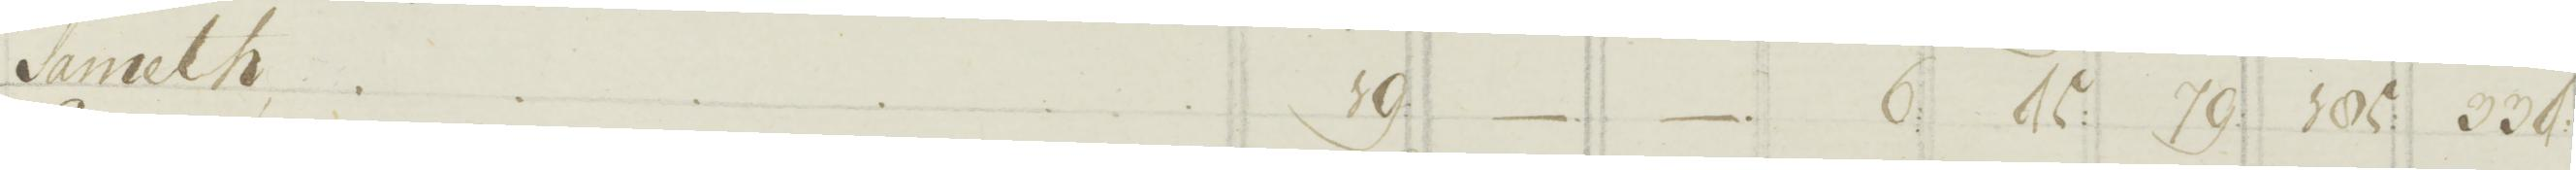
Sameth - - - - - - 19: —. —. 6: 45: 79: 185: 334
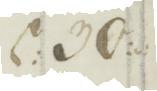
5: 30:.
